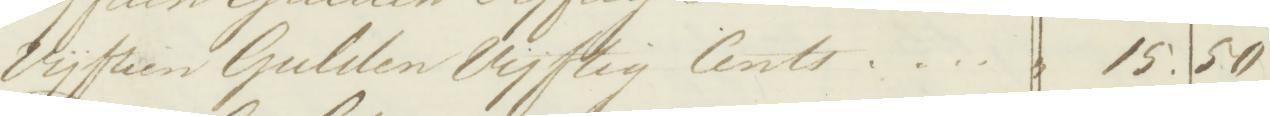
Vijftien Gulden Vijftig Cents . . . . „ 15.50
